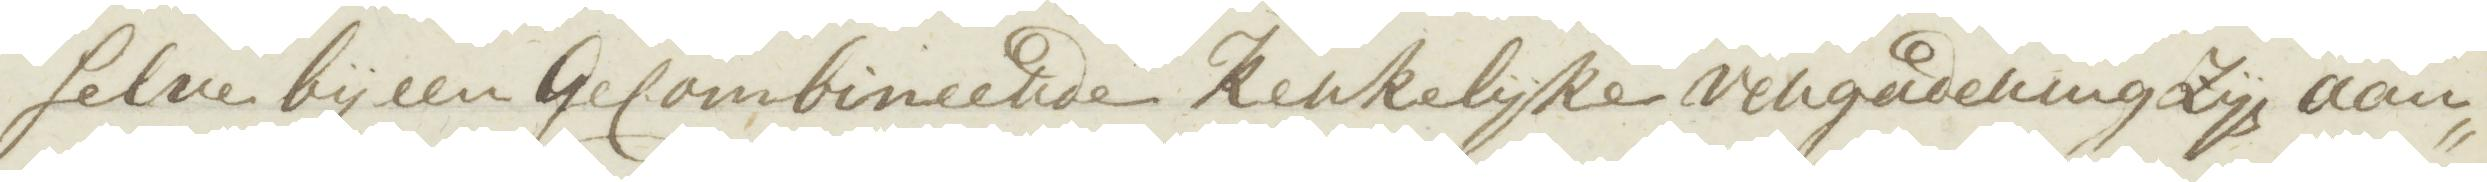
selve bij een gecombineerde kerkelijke vergadering zij aan„
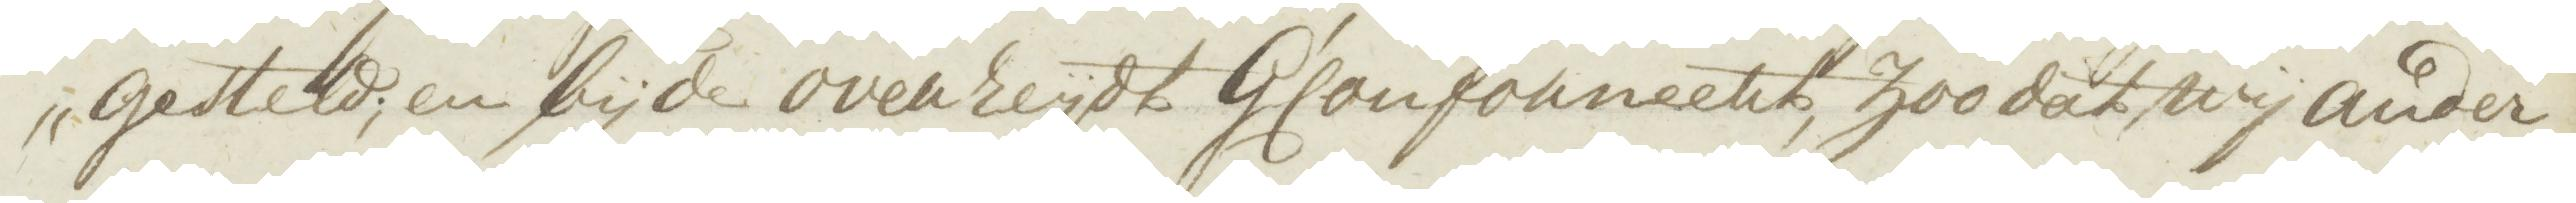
„gesteld; en bij de overheijdt G'Conforneert, zoo dat wij ander
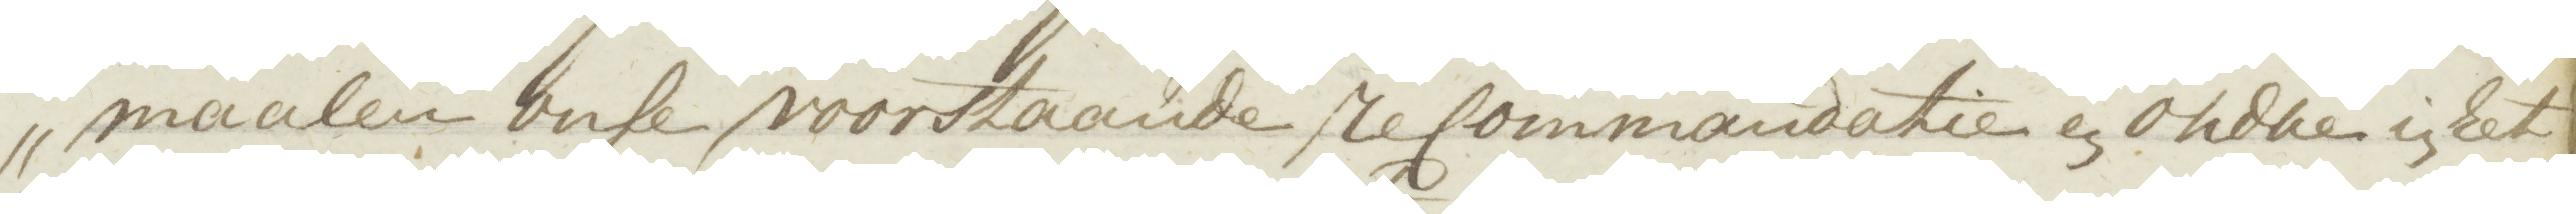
„maalen onse voorstaande recommandatie en ordre in het
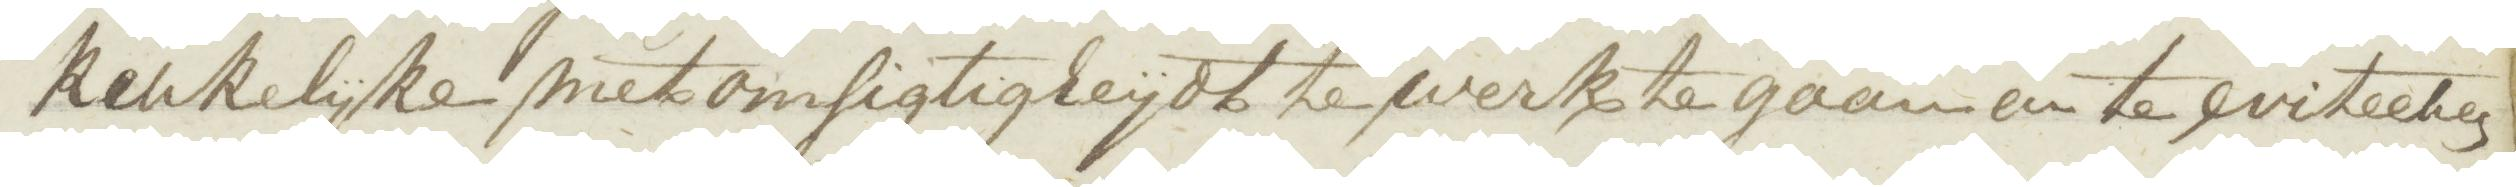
kerkelijke met omsigtigheijdt te werk te gaan en te eviteeren
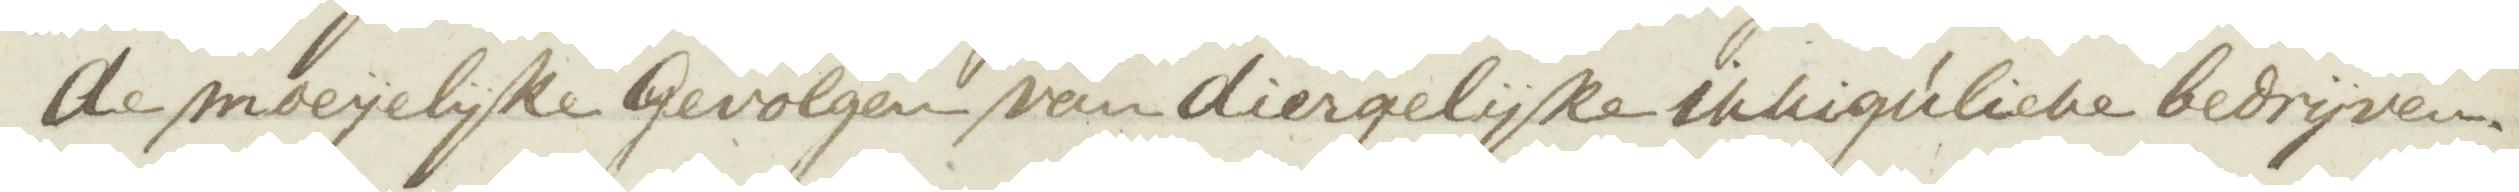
de moeijelijke gevolgen van diergelijke irriguliere bedrijven.
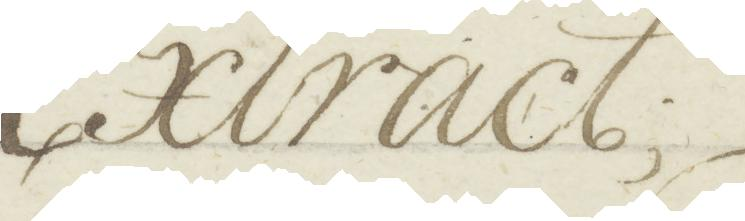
Extract;
